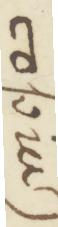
copia
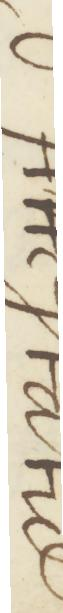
d' Attestatie
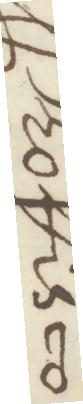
Pro fisco
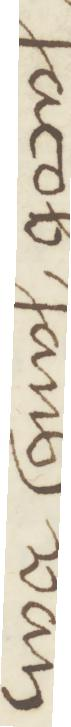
Jacob Jans van
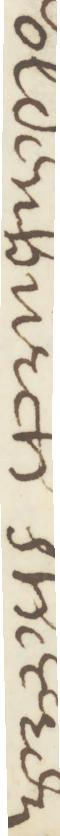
oldenburch sheeren
